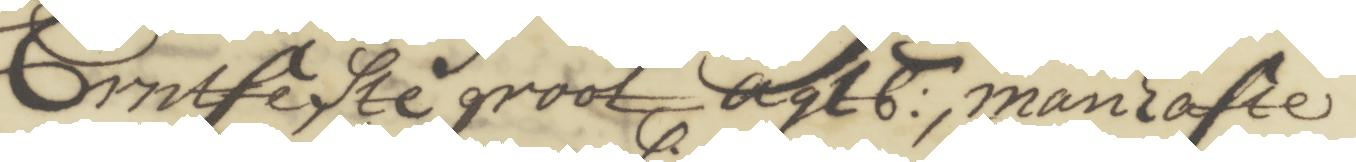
Erntfeste groot agtb:, manhafte
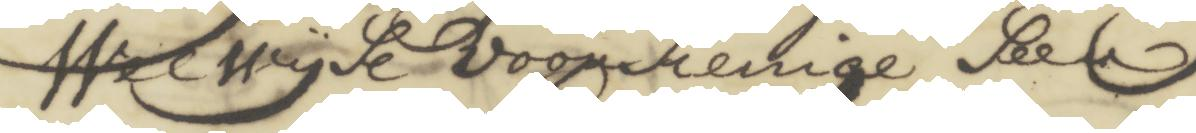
Wel wijse voorsienige seer
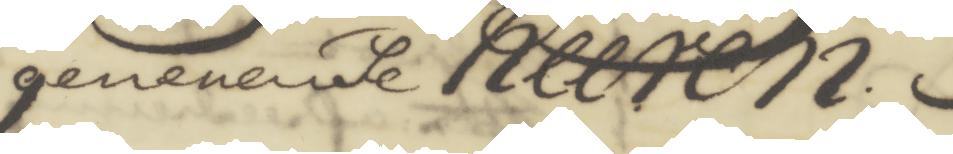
genereuse heeren. —
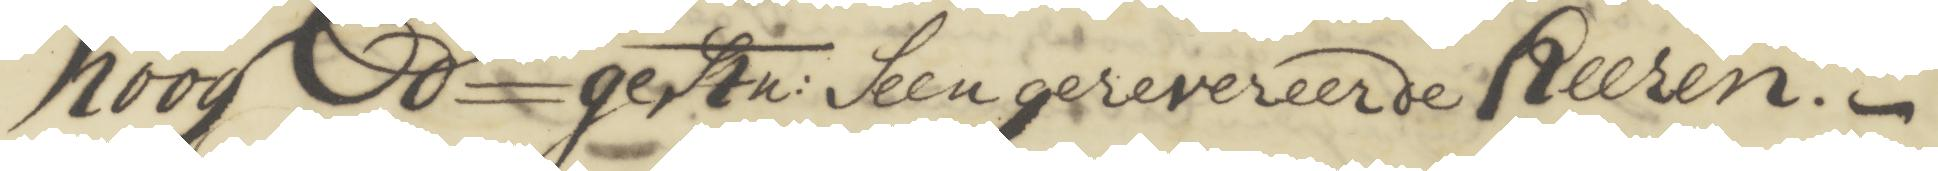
Hoog Ed=le gestr: seer gerevereerde Heeren. —
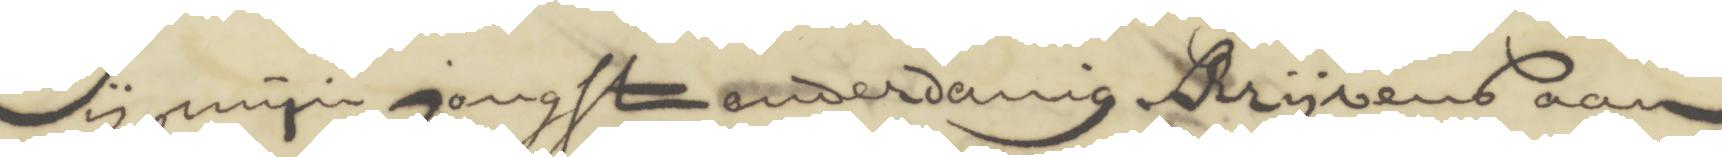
Bij mijn jongst onderdanig schrijvens aan
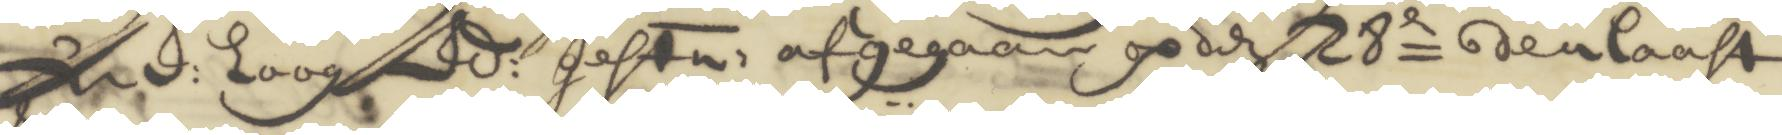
uE: hoog Ed: gestr: afgegaan op den 28=en der laast
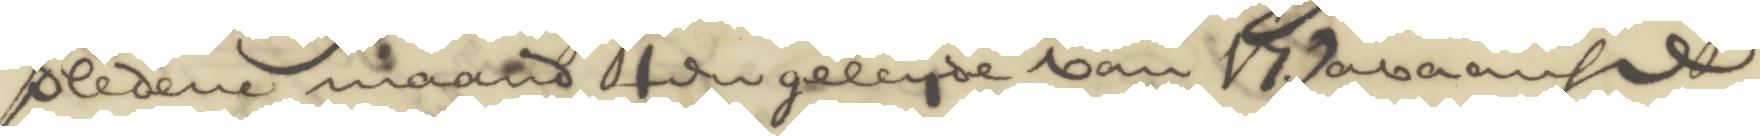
verledene maand ten geleijde van 17. Javaanse
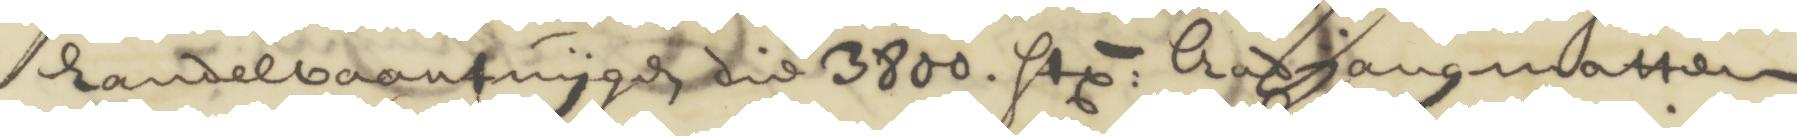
handelvaartuijgen die 3800. stx: kadjangmatten
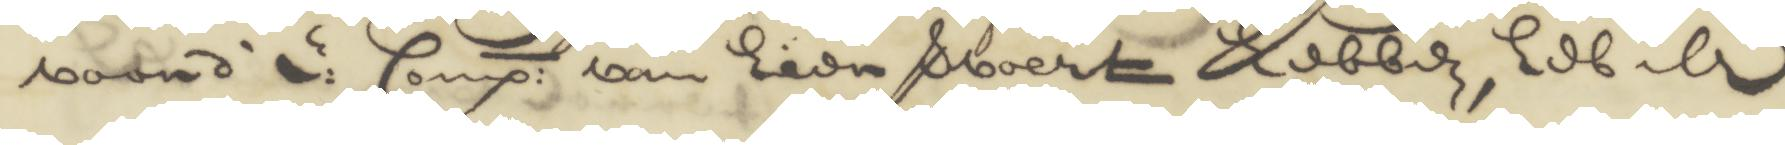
voor d’ E: Comp: van hier vervoert hebben, heb ik
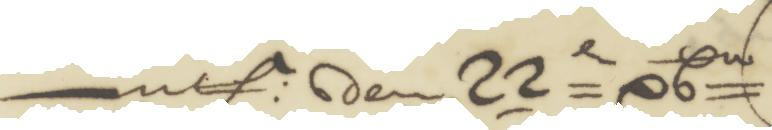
Ontf: den 22=en xb=r
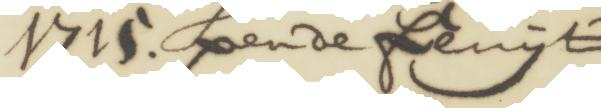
1715. per de fluijt
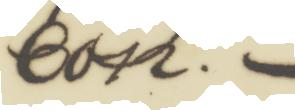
Bon. —
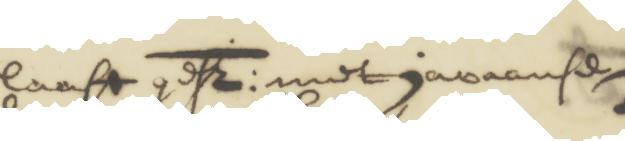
laast gesz: met javaanse
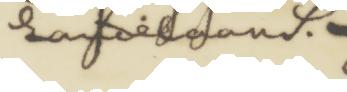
handelaars. —
